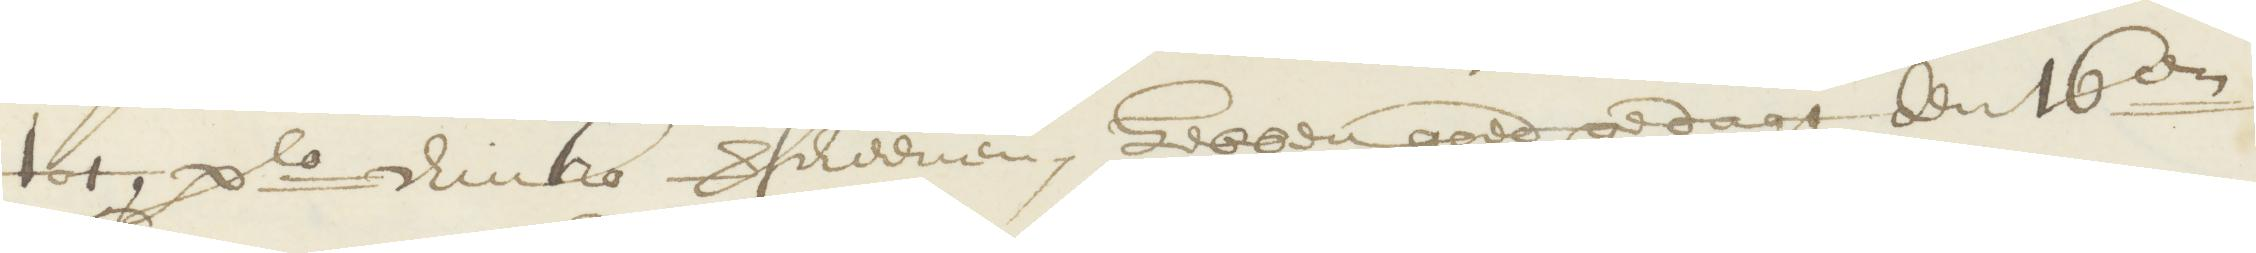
tot p=lo chinko verscheenen, hebben goed gedagt den 16=en
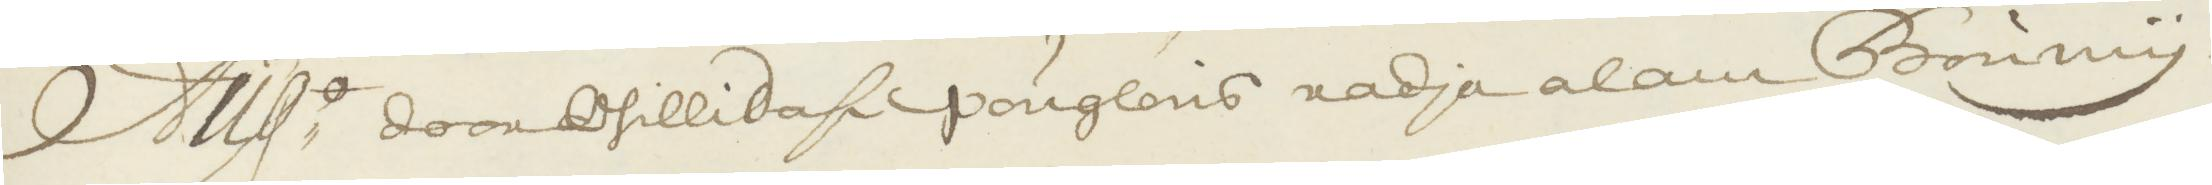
Aug„o door de sillidase pouglous radja alam Boumij
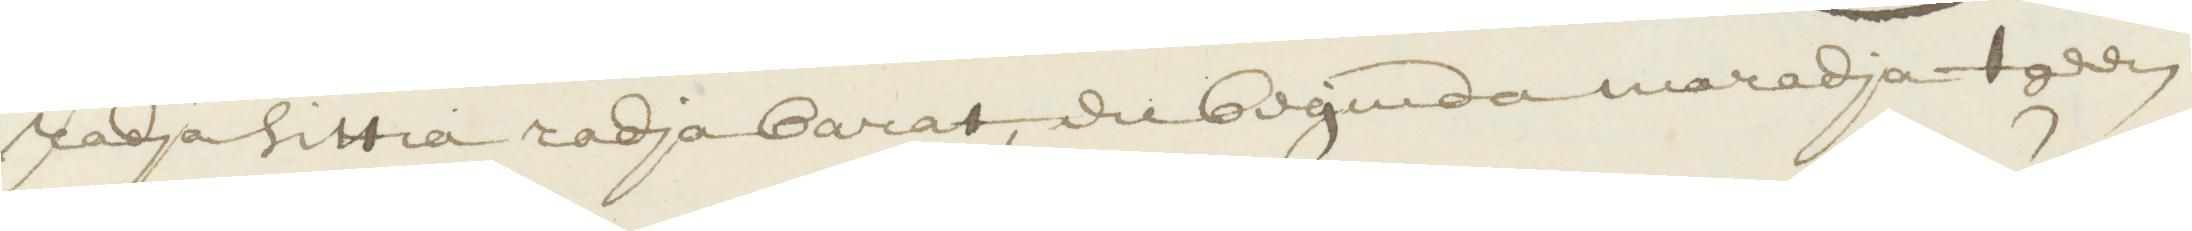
radja sittia radja barat, en beginda maradja tgeen
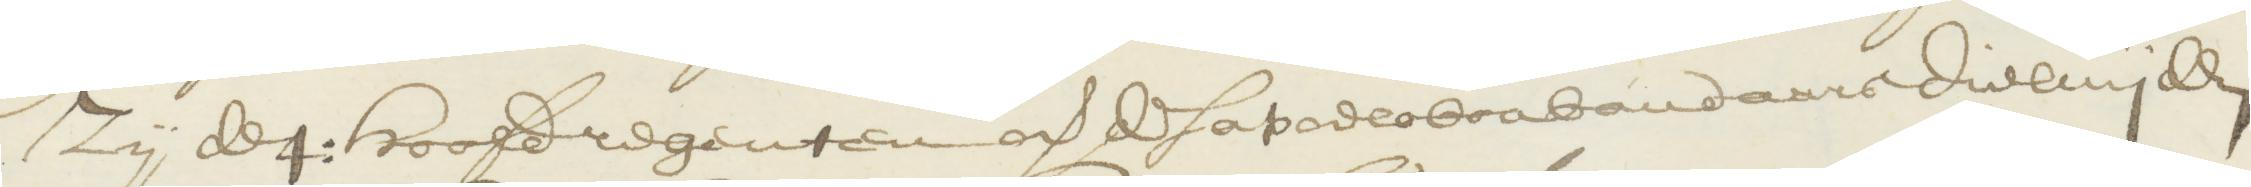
zij de 4: hoofdregenten over de sapoeloboabandaars die luijden
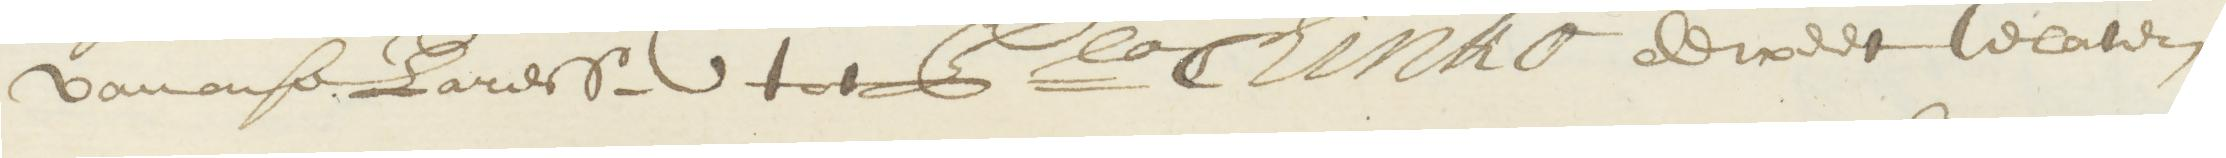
van onse Laress-o O tot P=lo Chinko de weet te laten
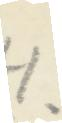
174.
